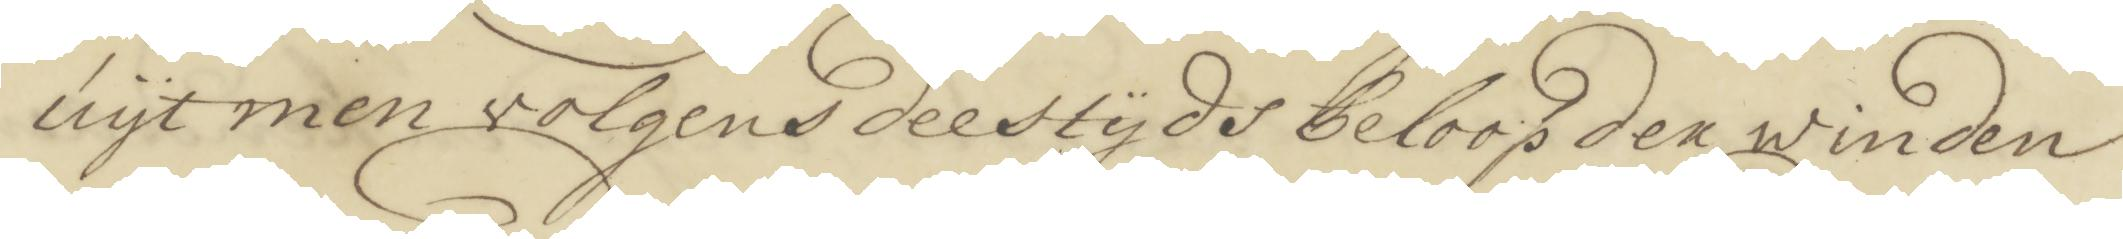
uijt men volgens deestijds beloop der winden
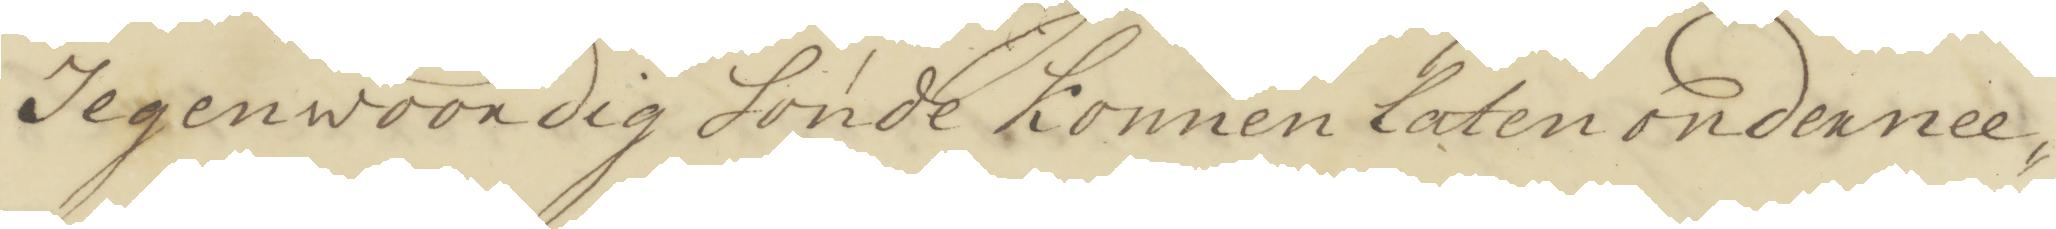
Iegenwoordig soude konnen laten ondernee„
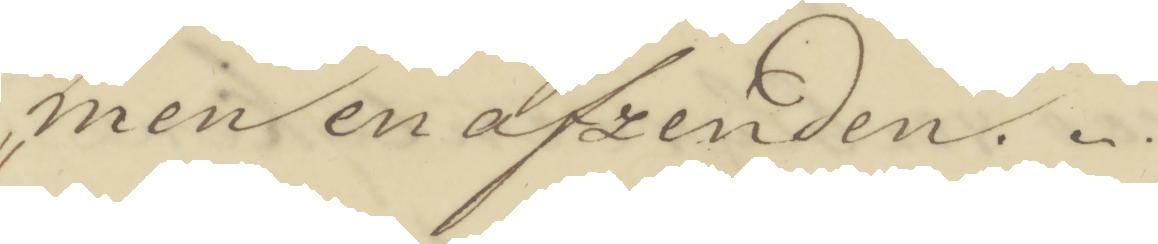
men en afzenden. —
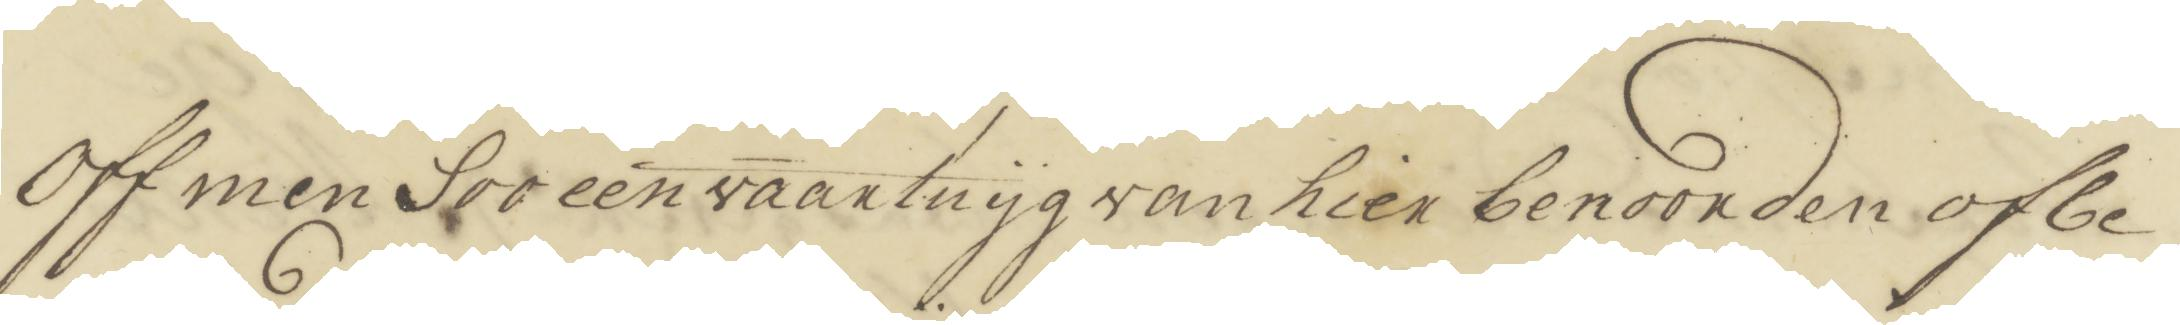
Off men soo een vaartuijg van hier benoorden of be
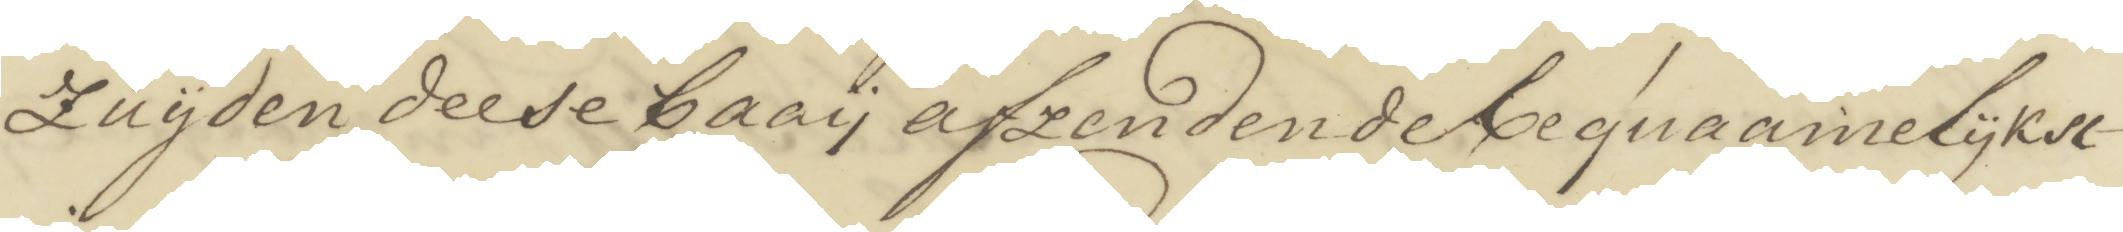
zuijden deese baaij afzenden de bequaamelijkst
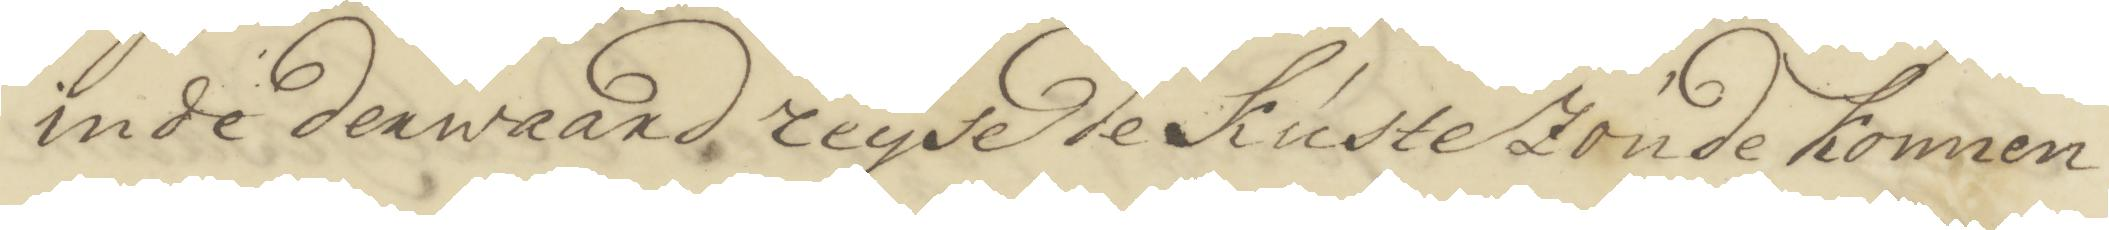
inde derwaard reijse de kuste zoude konnen
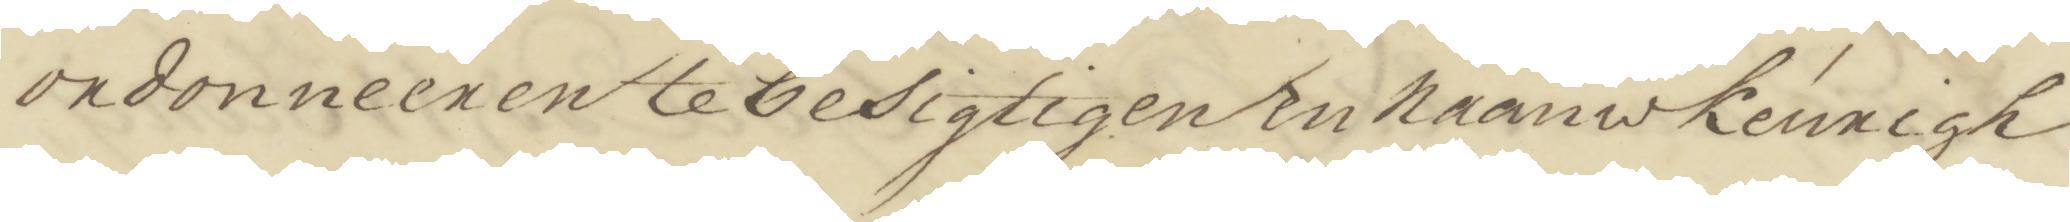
ordonneeren te besigtigen en naauwkeurigh
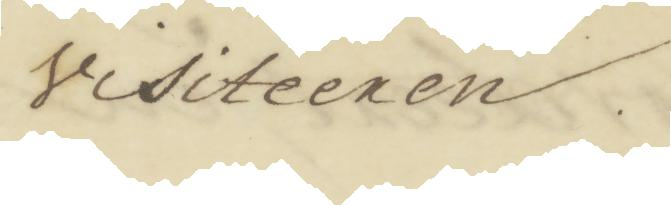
visiteeren.
